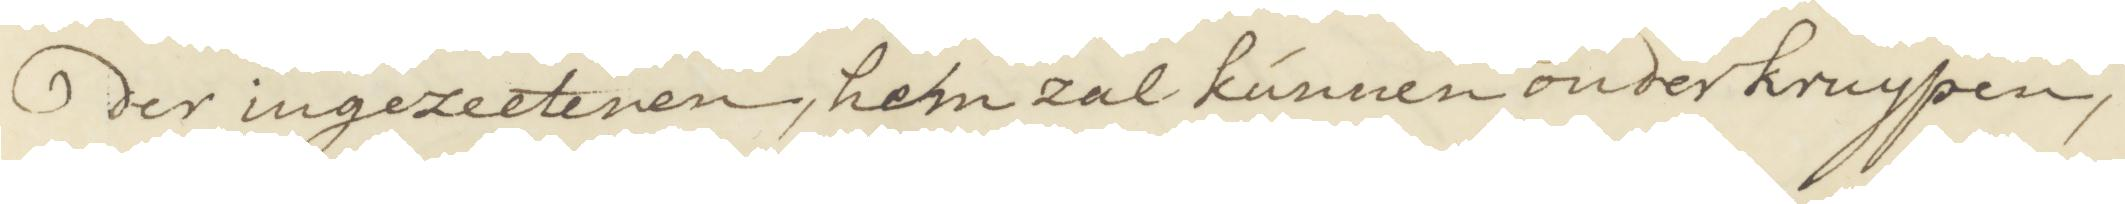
der ingezeetenen, hem zal kunnen onderkruypen,
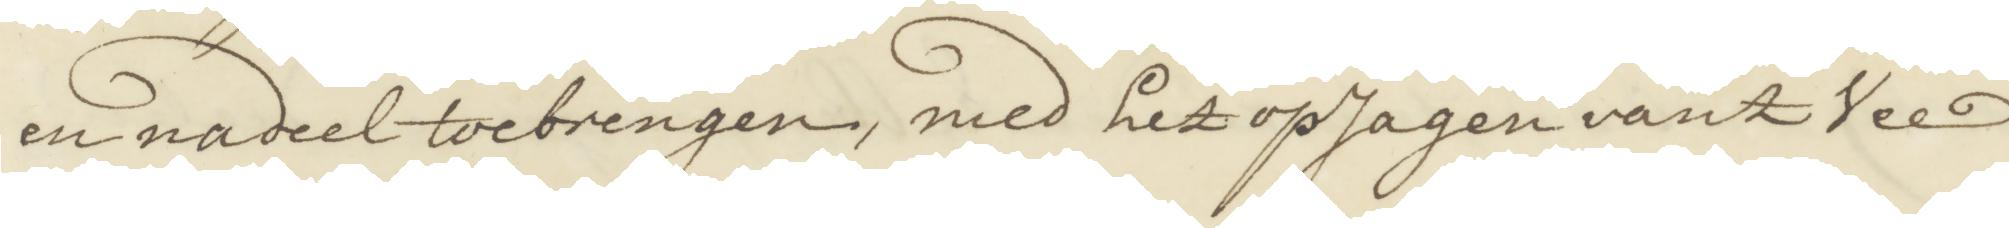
en nadeel toebrengen, med het opjagen vant vee
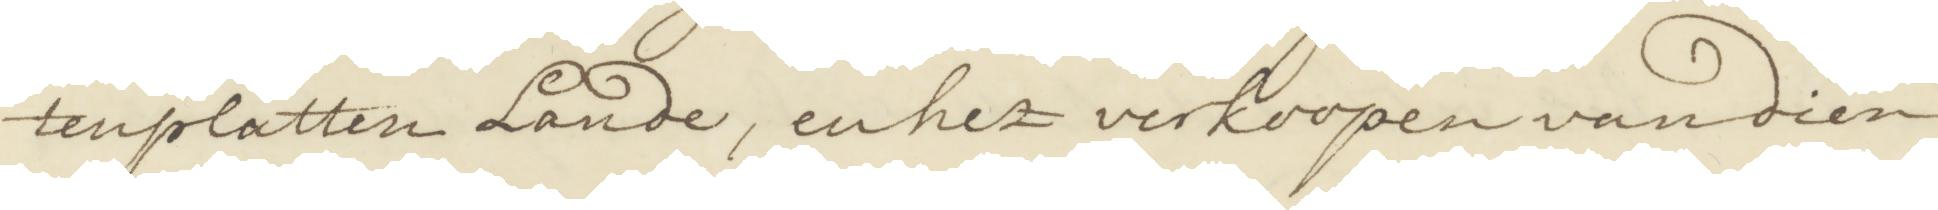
tenplatten Lande, en het verkoopen van dien
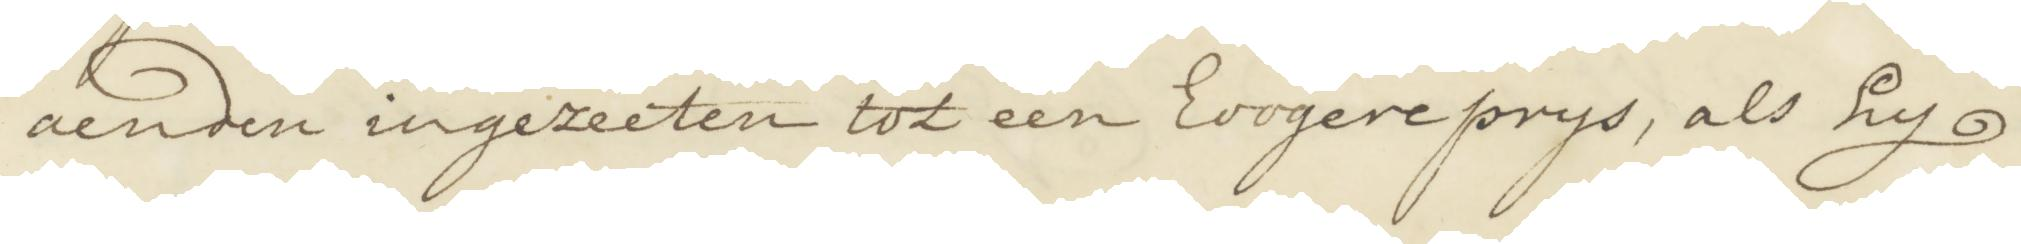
aenden ingezeeten tot een hoogere prys, als hy
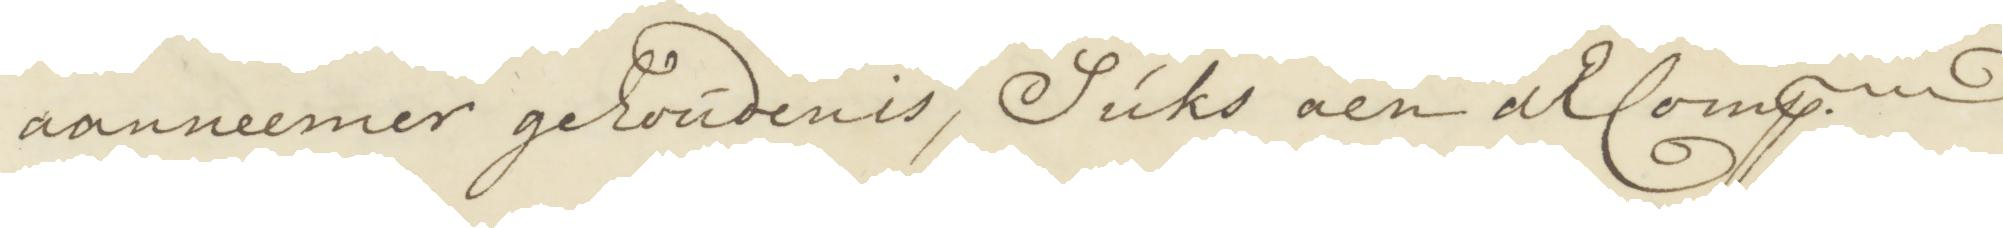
aanneemer gehouden is, Suks aen dEComp.m
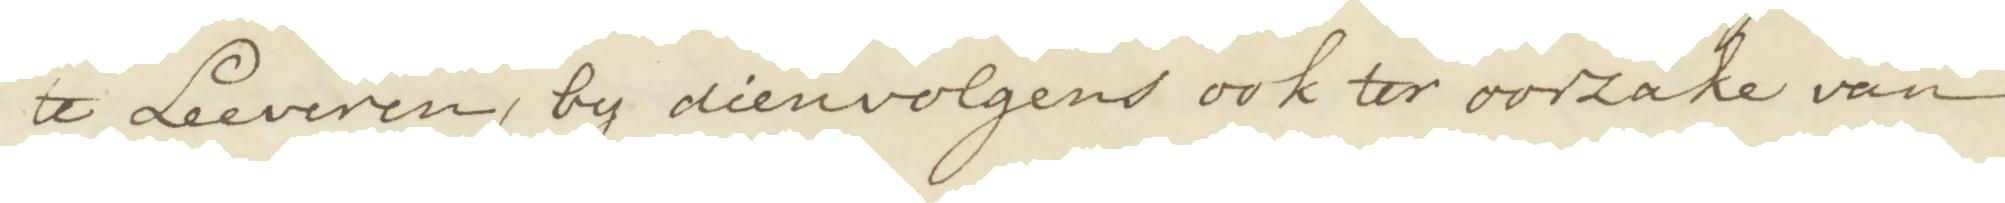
te Leeveren, by dienvolgens ook ter oorzake van
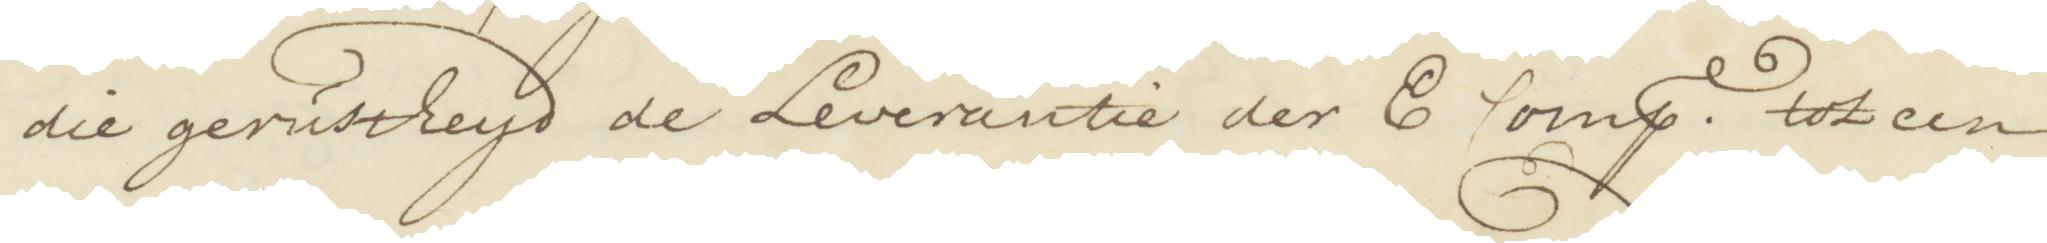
die gerustheyd de Leverantie der E Comp.e tot een
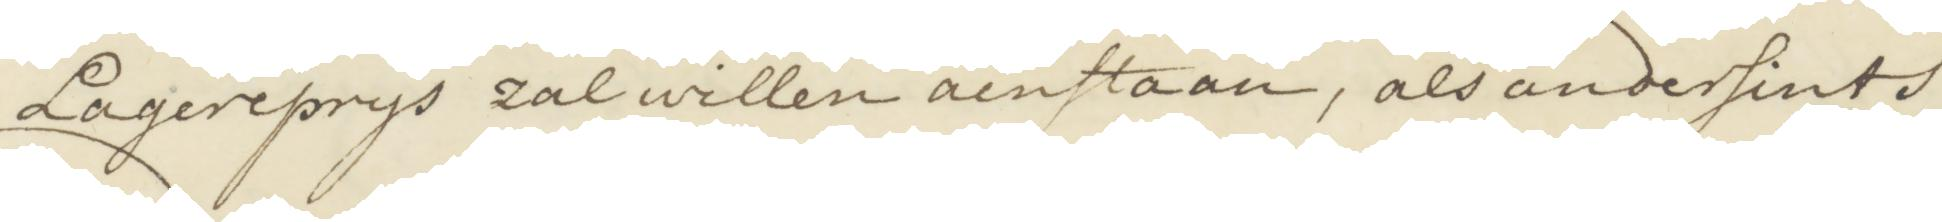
Lagereprys zal willen aenstaan, als andersints
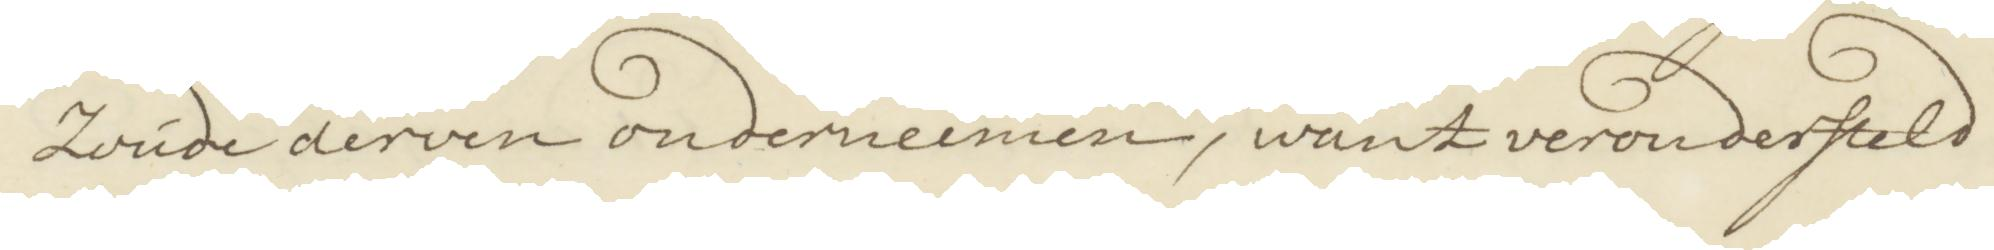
zoude derven onderneemen, want verondersteld
